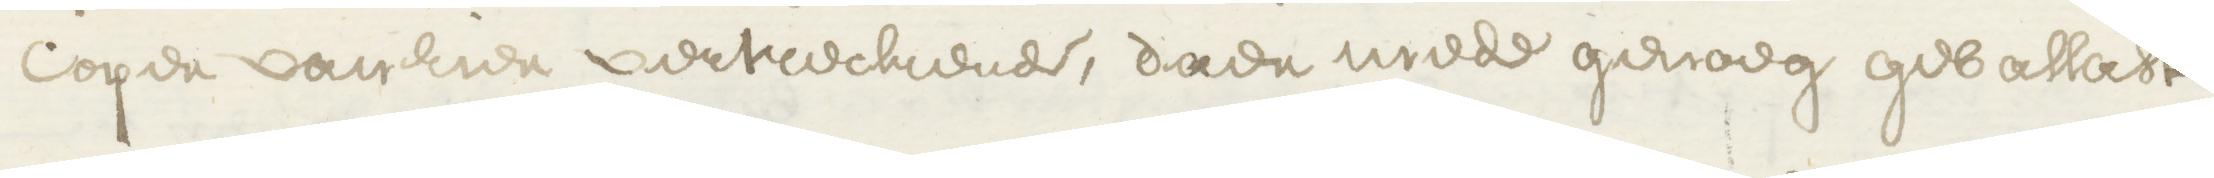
coper van hier vertreckende, daer mede genoeg geballast
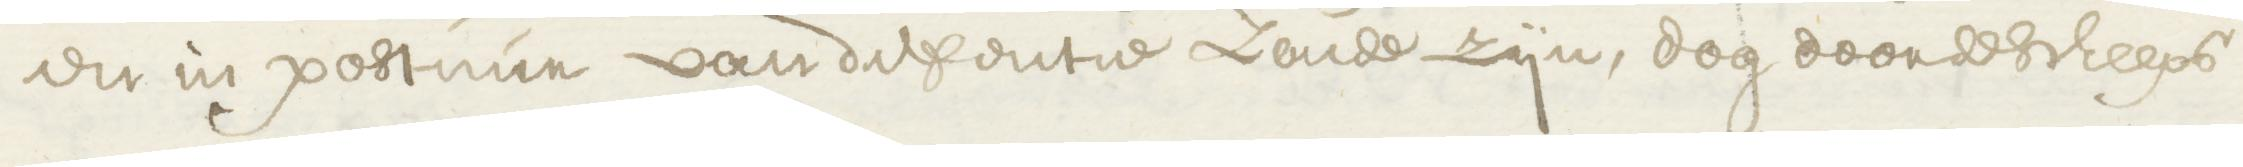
en in postuur van defentie zoude zijn, dog door de scheeps
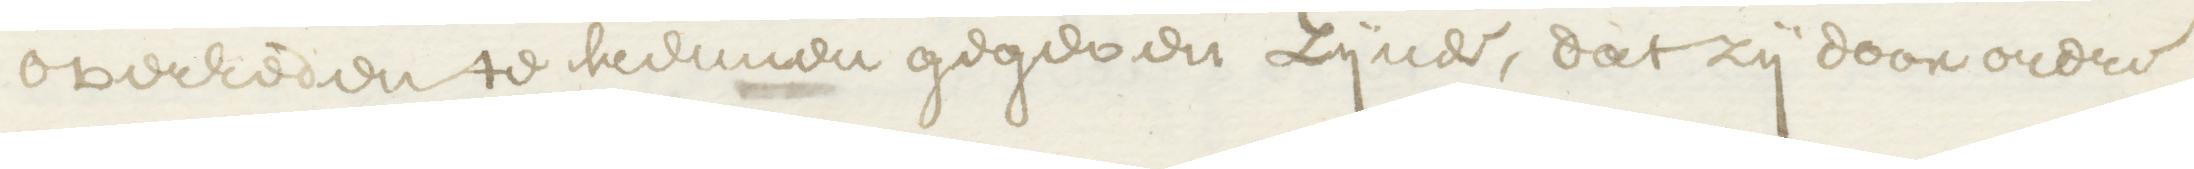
overheden te kennen gegeven zijnde, dat zij door ordre
